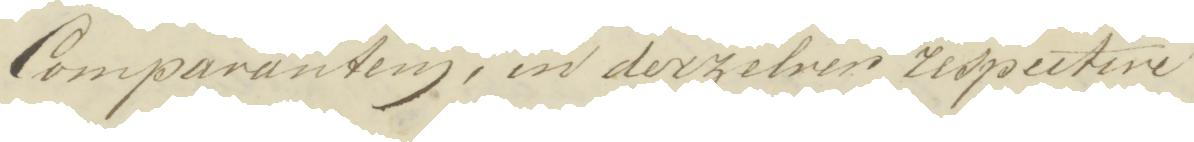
Comparanten, in derzelver respective
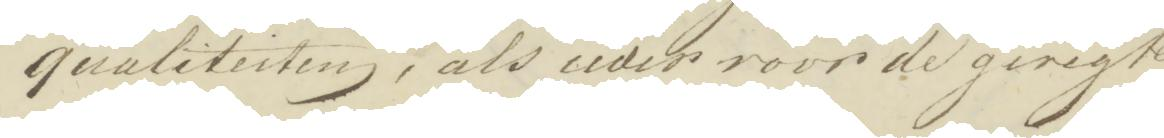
qualiteiten, als ieder voor de geregte
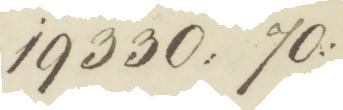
19330: 70:
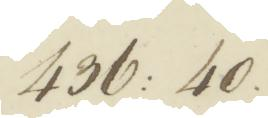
436: 40.
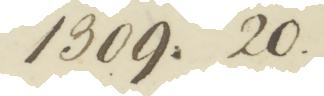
1309: 20.
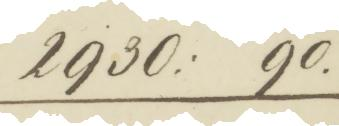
2930: 90.
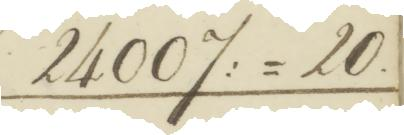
24007: = 20.
